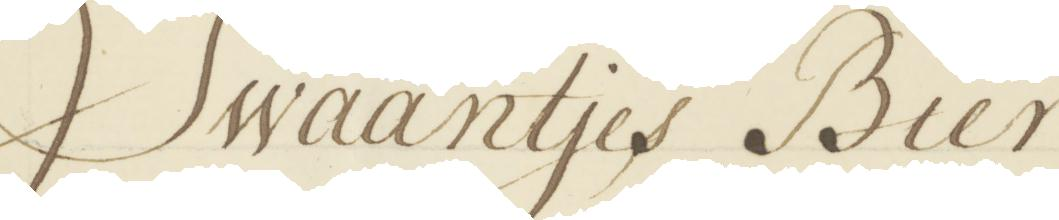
Swaantjes Bier
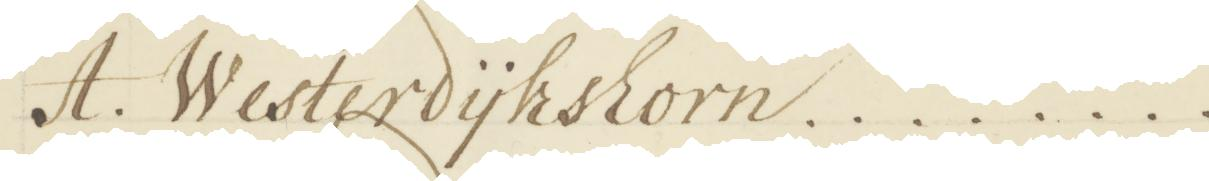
A. Westerdijkshorn . . . . . . . .
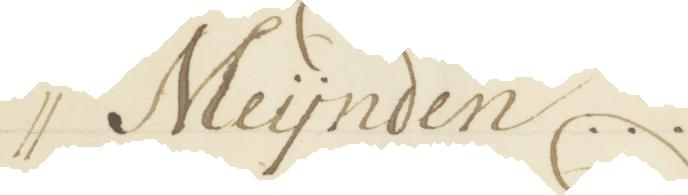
„ Meijnden . . .
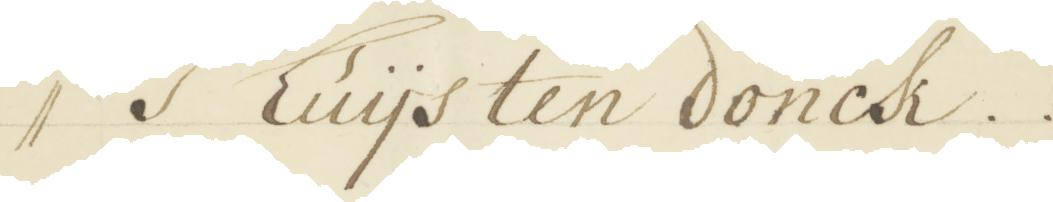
„ 'T huijs ten donck . .
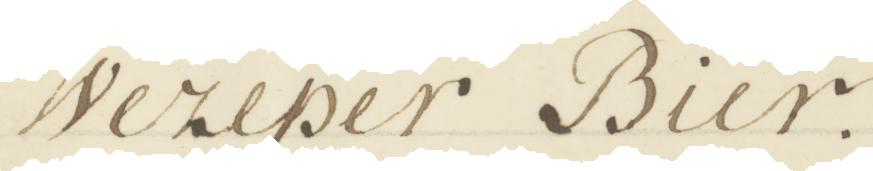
Wezeper Bier.
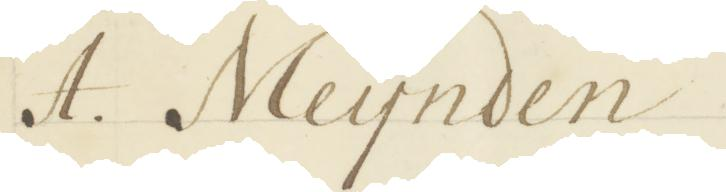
A: Meijnden
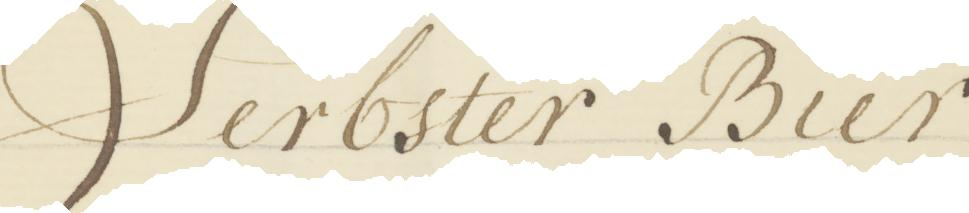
Serbster Bier
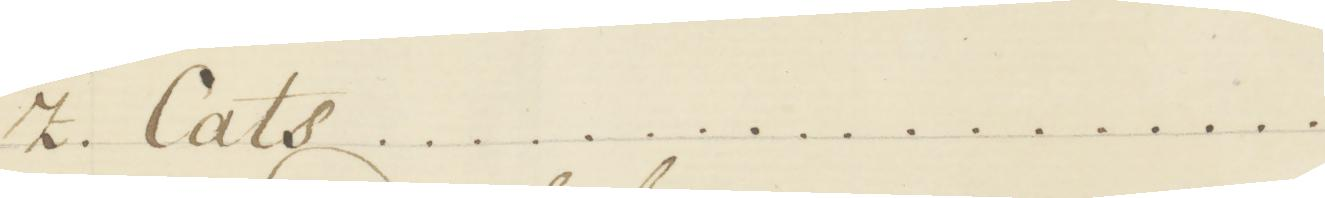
Z. Cats . . . . . . . . . . . . . . . . .
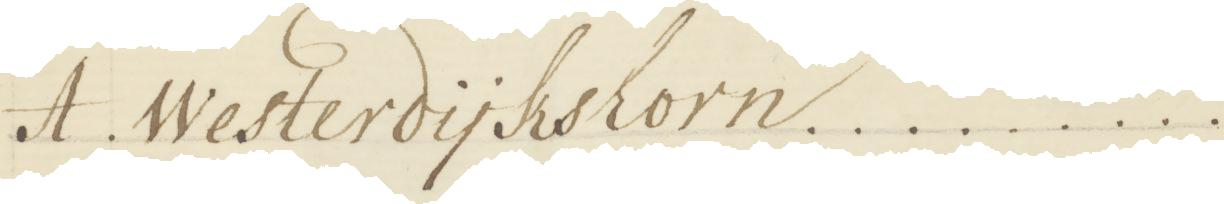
A. Westerdijkshorn . . . . . . . . .
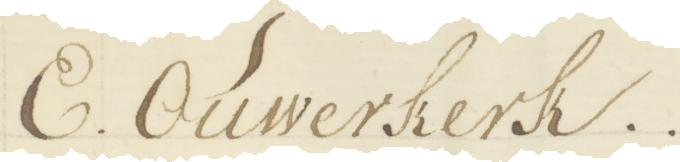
E. Ouwerkerk . .
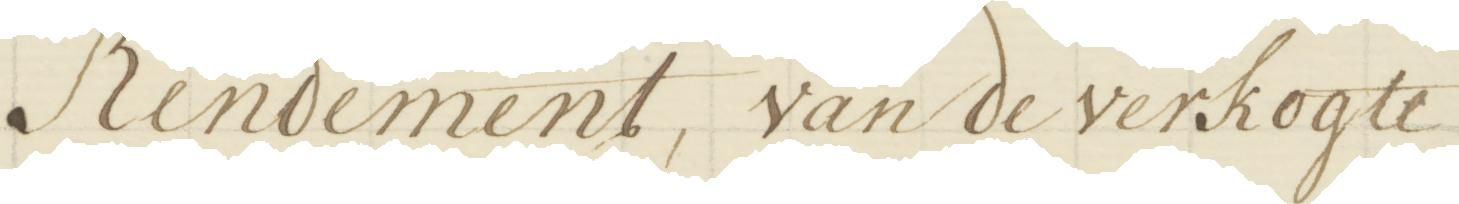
Rendement, van de verkogte
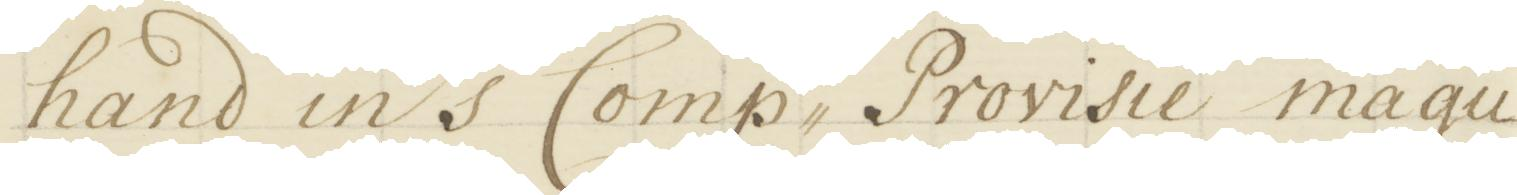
hand in ’s Comp„s Provisie magu
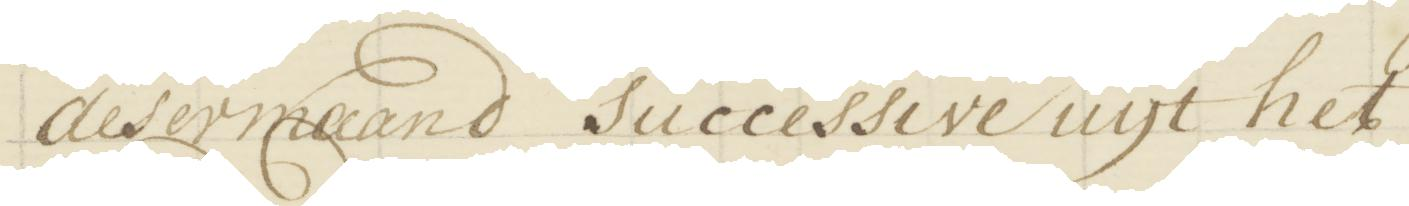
desermaand successive uijt het
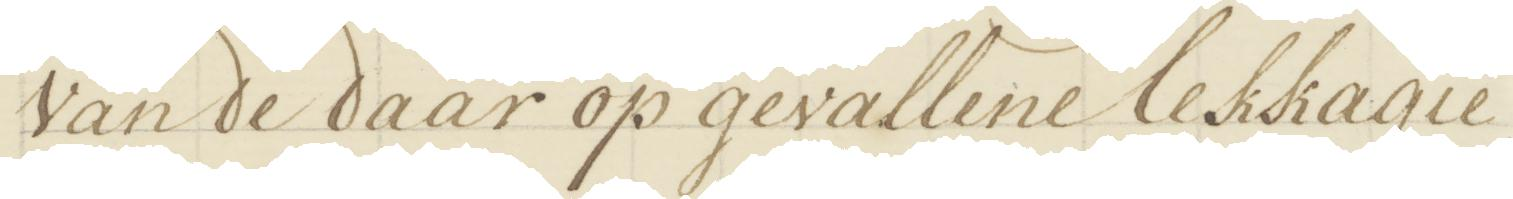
van de daar op gevallene lekkagie
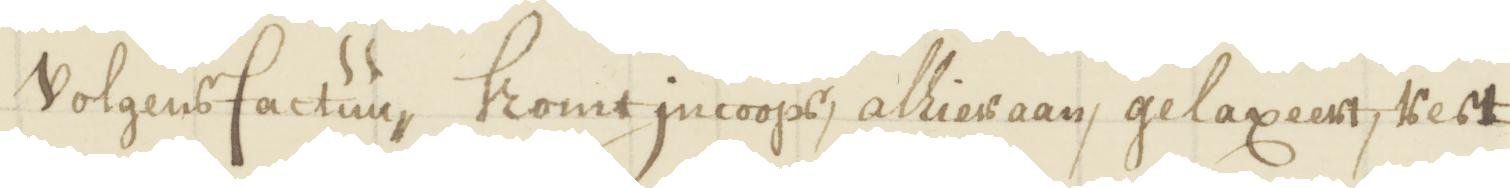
Volgens factuur„ komt jncoops, alhier aan, gelaxeert, rest
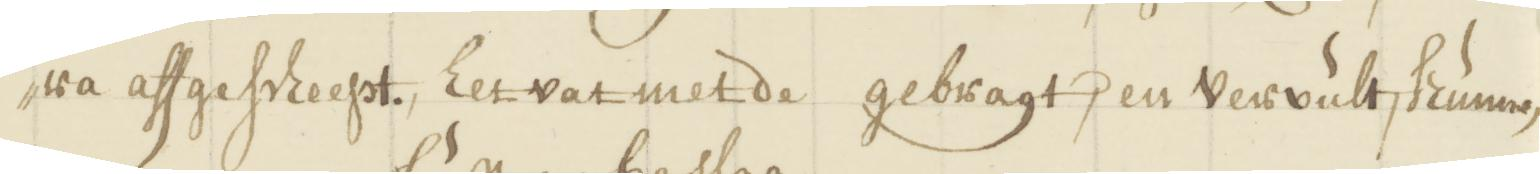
„ra afgescheept. het vat met de gebragt, en vervult, kunne
